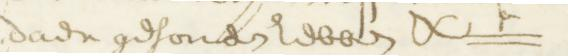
daer gesonden hebben &=a
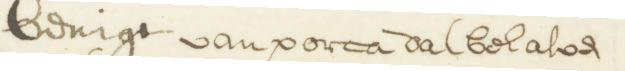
berigt van porca dat behalven
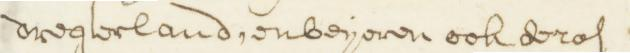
dregterland, en beijeren ook de ros
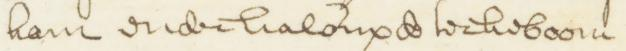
kam en de chialoup de teckeboom
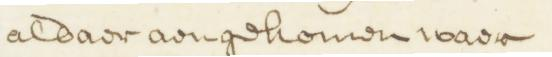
aldaer aengekomen waer
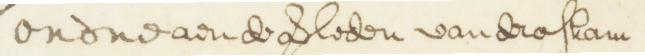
ordre aen de overleden van de roskam
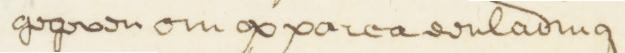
gegeven om op porca een lading
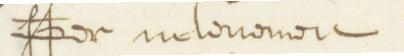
pper in te nemen
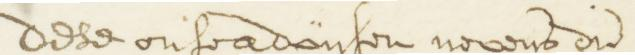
dese onse advijsen nevens die
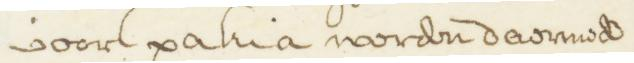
voor t patria werden daermede
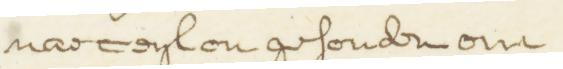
nae ceylon gesonden om
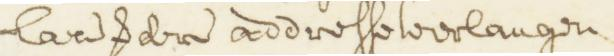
hare verdere addresse te erlangen
